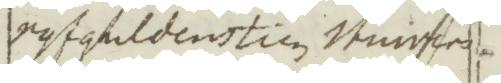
vyf guldens tien stuivers
